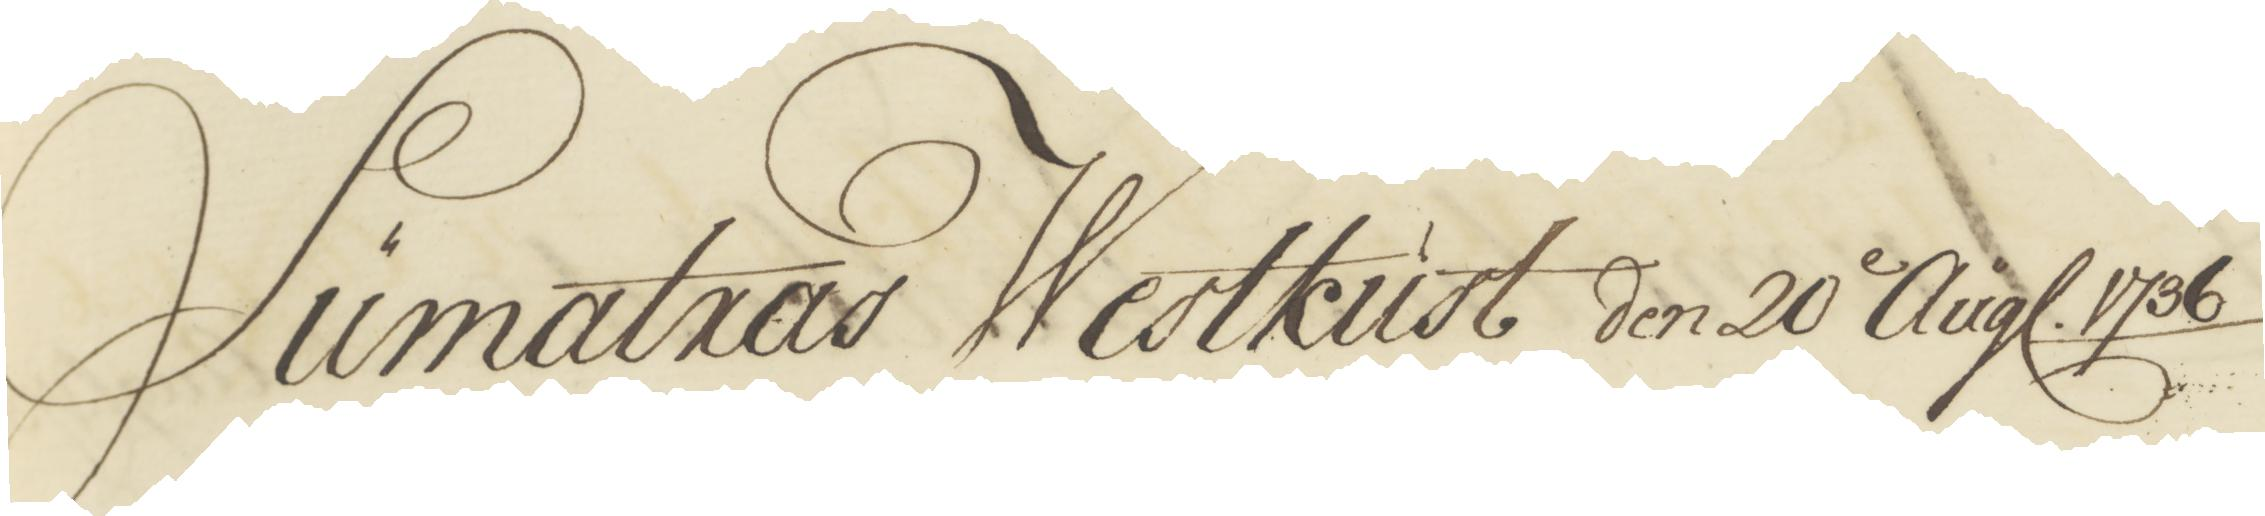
Sumatras Westkust den 20:e Aug. 1736
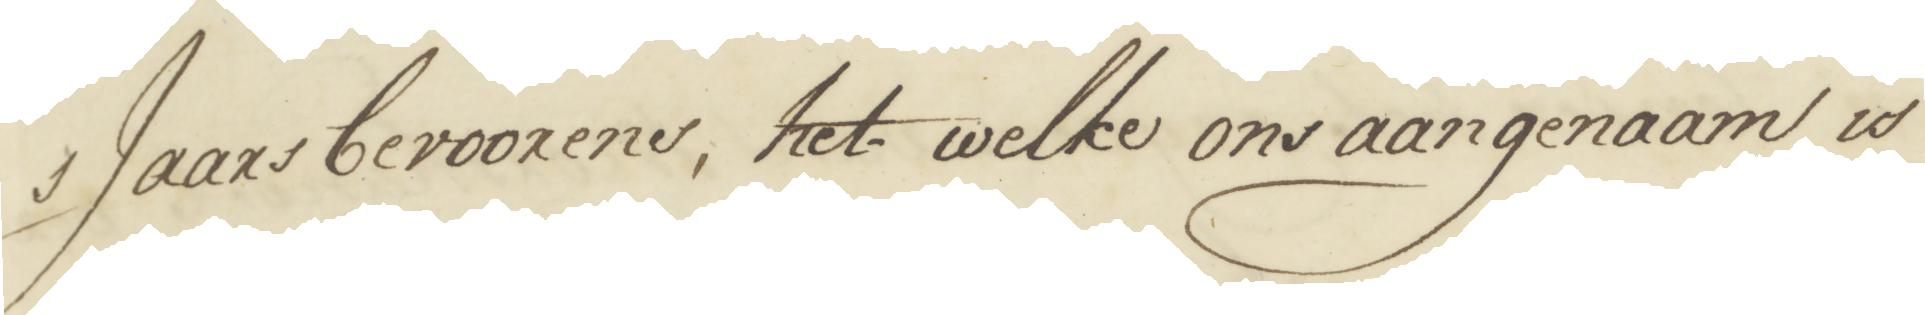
s Jaars bevoorens, het welke ons aangenaam is
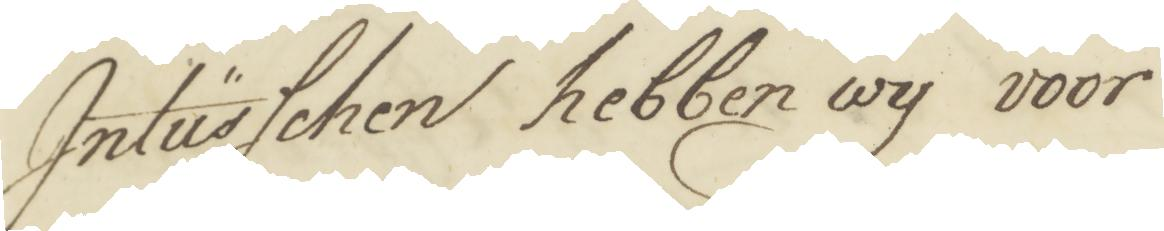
Jntusschen hebben wy voor
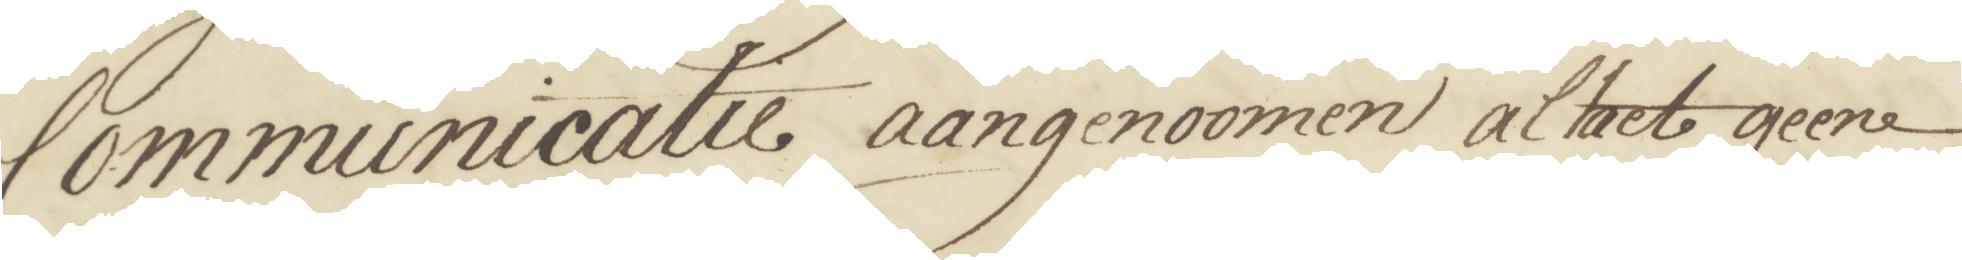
Communicatie aangenoomen al het geene
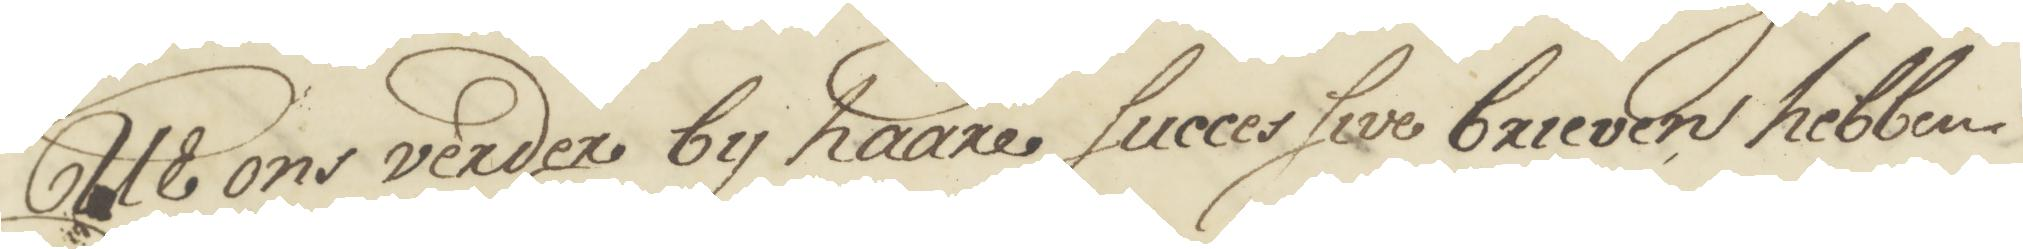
UE ons verder by haare successive brieven hebben
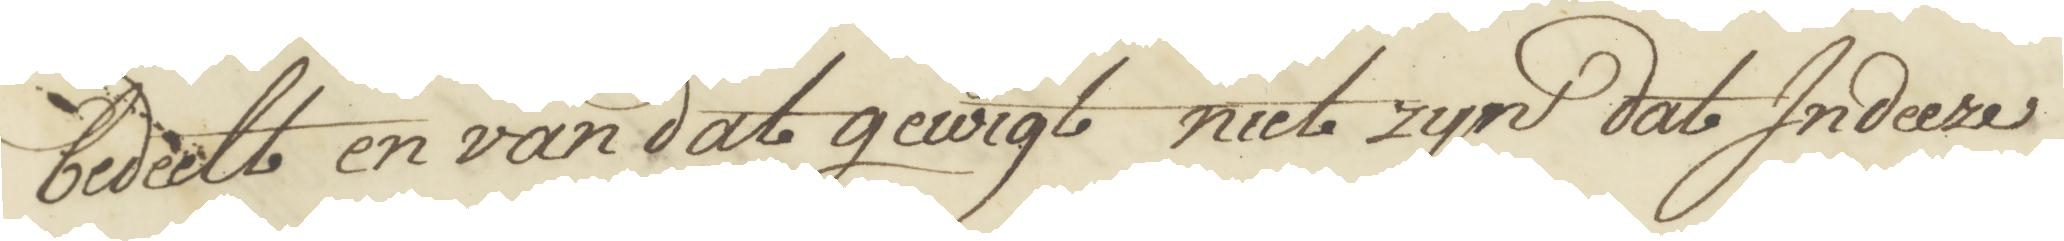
bedeelt en van dat gewigt niet zyn dat In deeze
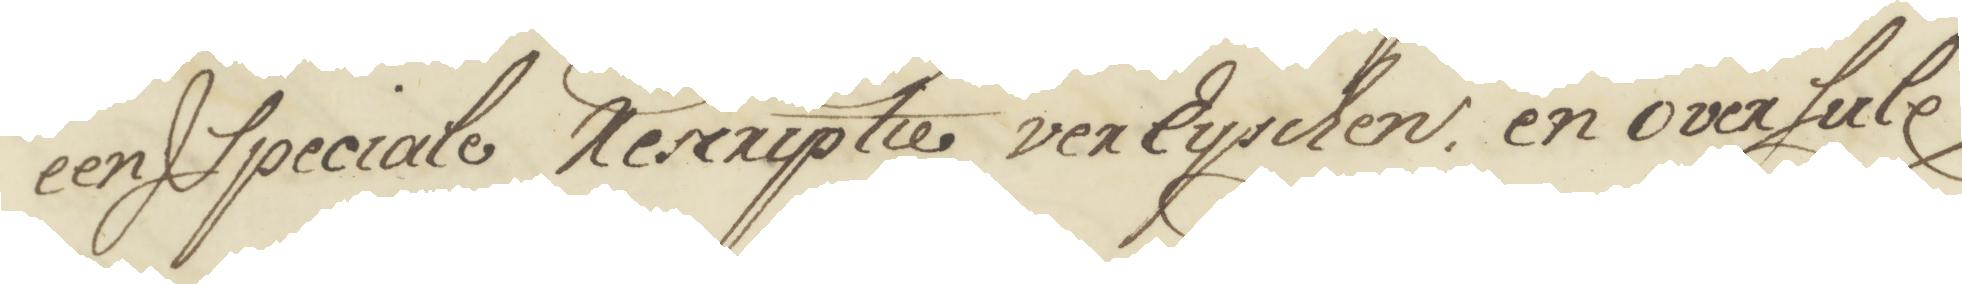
een Speciale rescriptie verEyschen, en over sulx
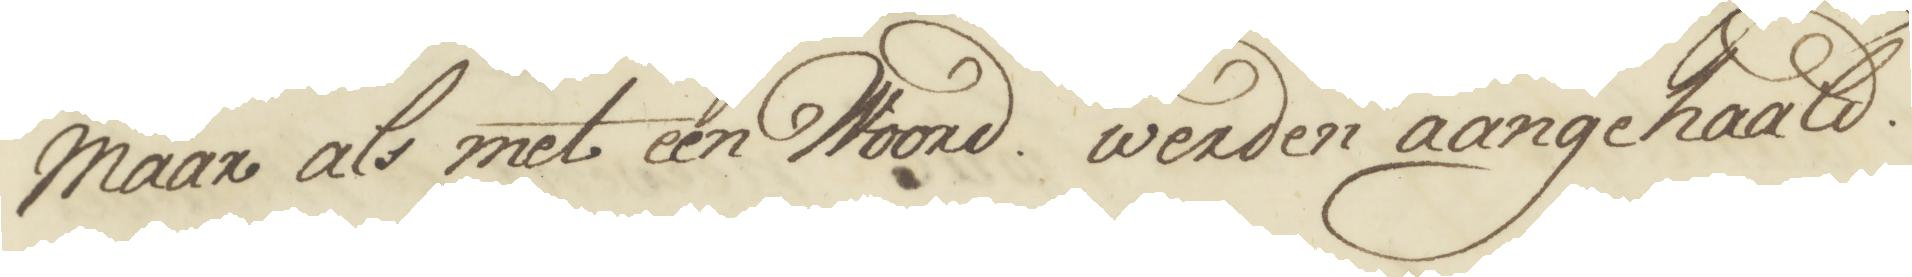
maar als met een Woord. werden aangehaald.
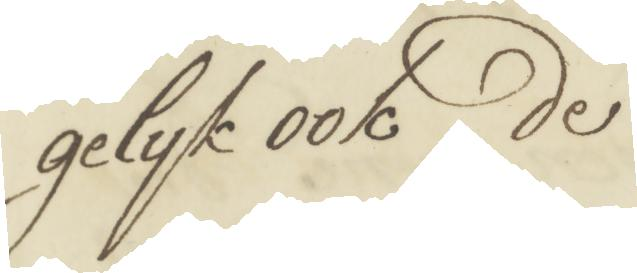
gelyk ook de
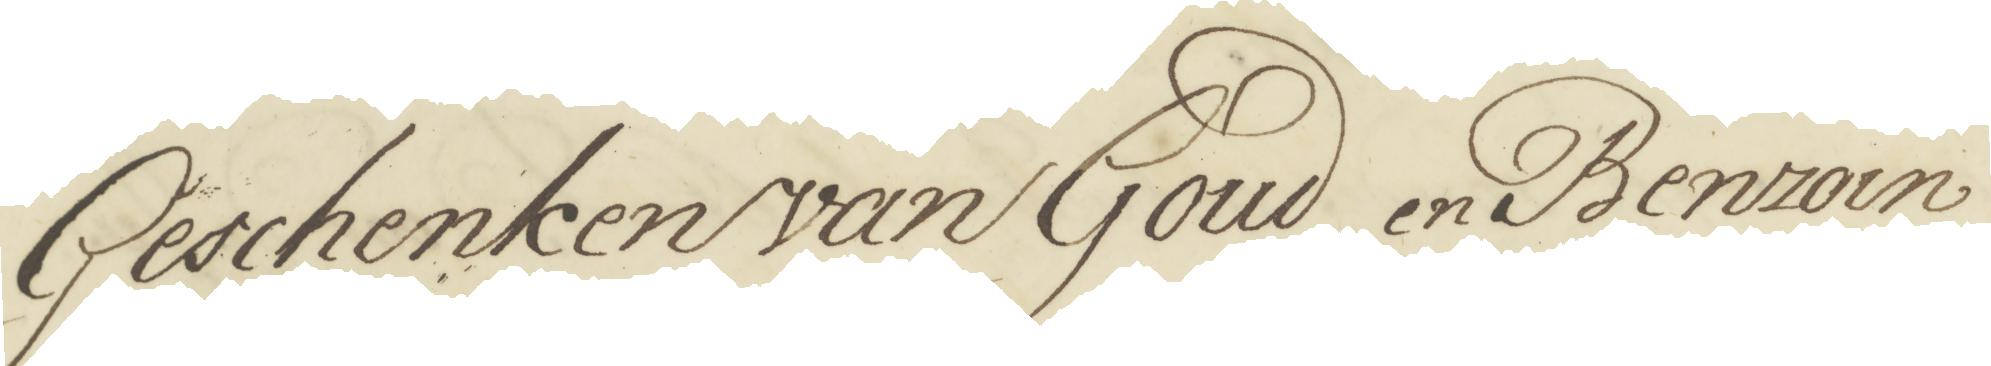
Geschenken van Goud, en Benzoin
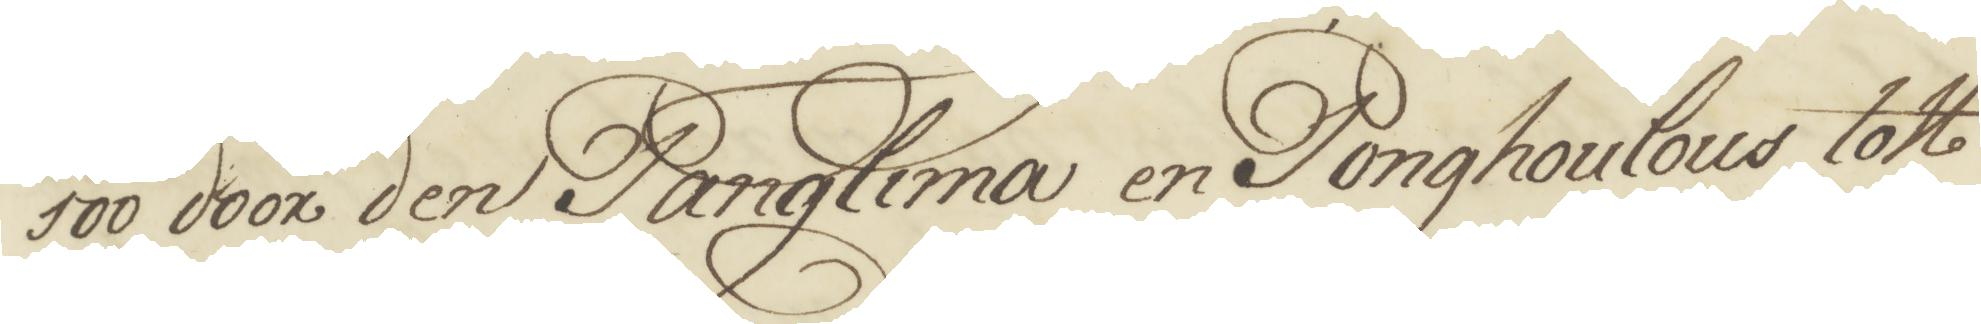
soo door den Panglima en Ponghoulous tott
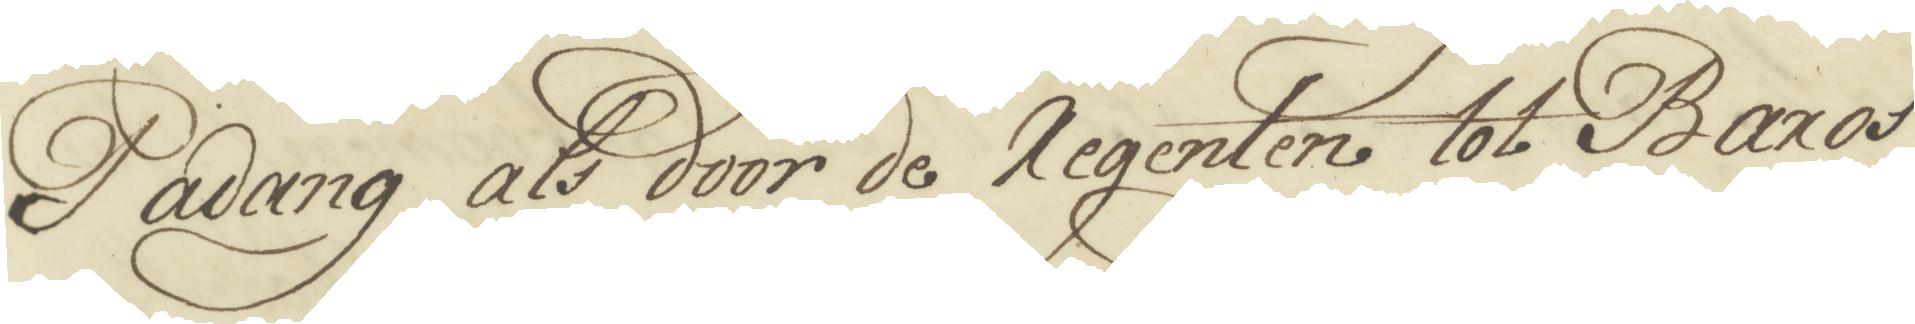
Padang als door de regenten tot Baros
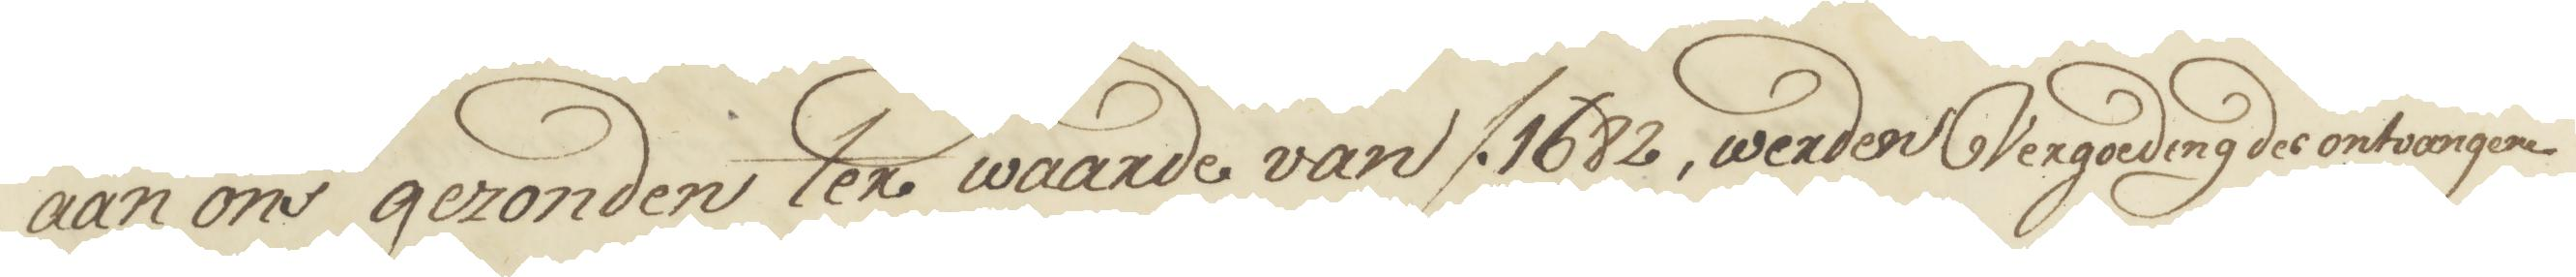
aan ons gezonden ter waarde van ƒ1682, werden Vergoeding der ontvangen
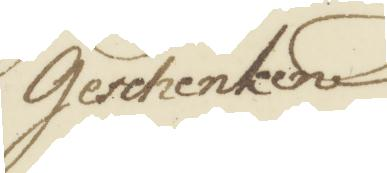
geschenken
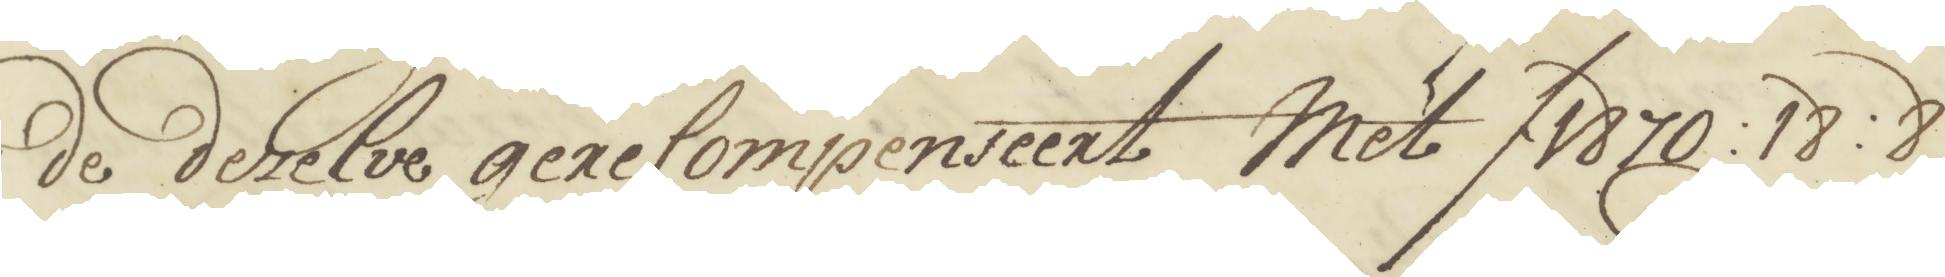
de dezelve gerecompenseert met ƒ 1870:18:8
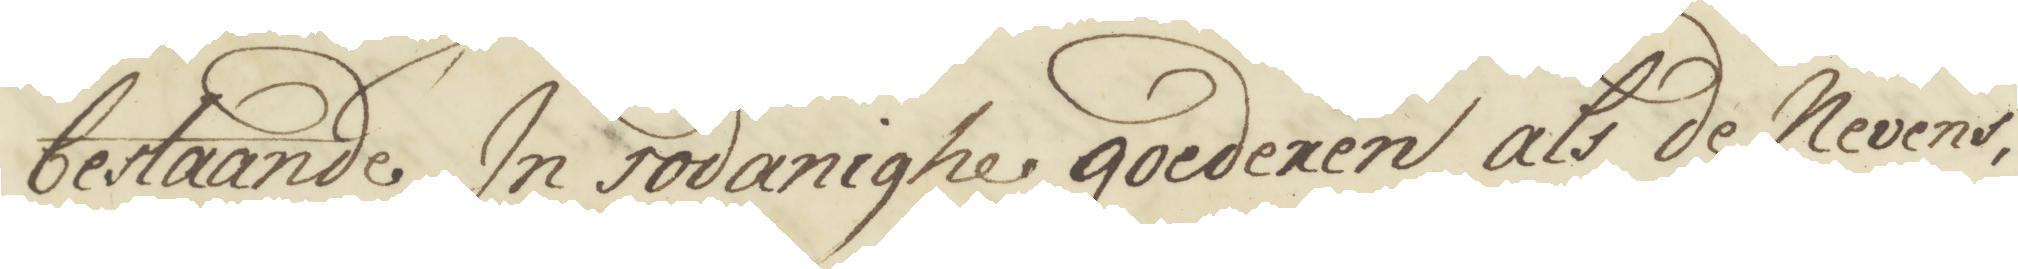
bestaande Jn sodanighe goederen als de Nevens,
